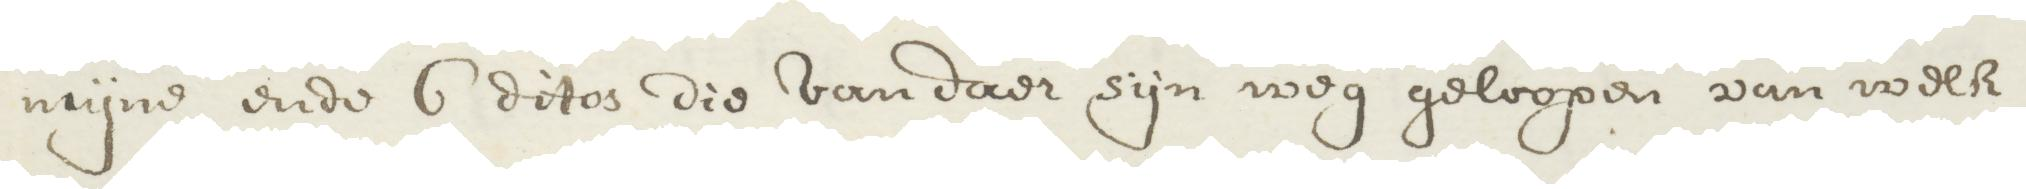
mijne ende 6 ditos die van daer sijn weg geloopen van welk
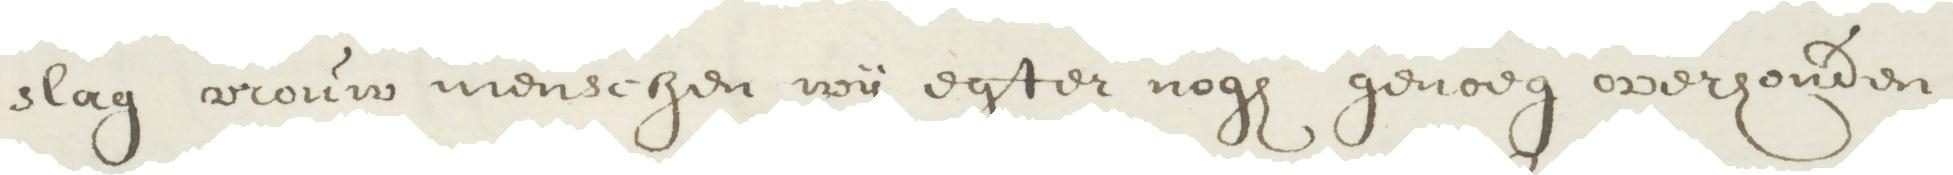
slag vrouw menschen wij egter nogh genoeg overhouden
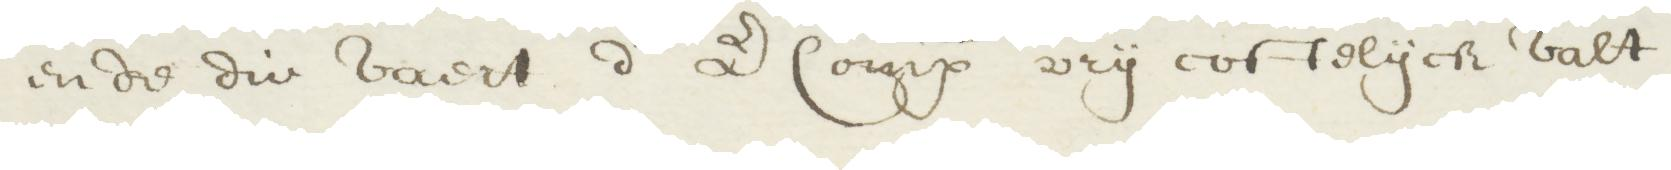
ende die vaert d' E Comp vrij costelijck valt
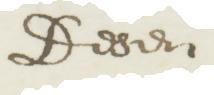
Desen
